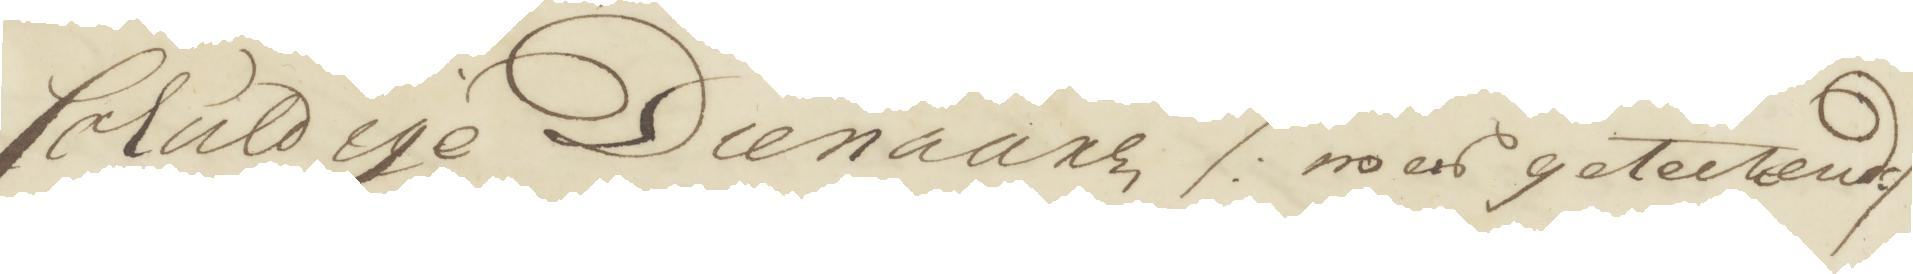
schuldige Dienaaren /: was geteekend
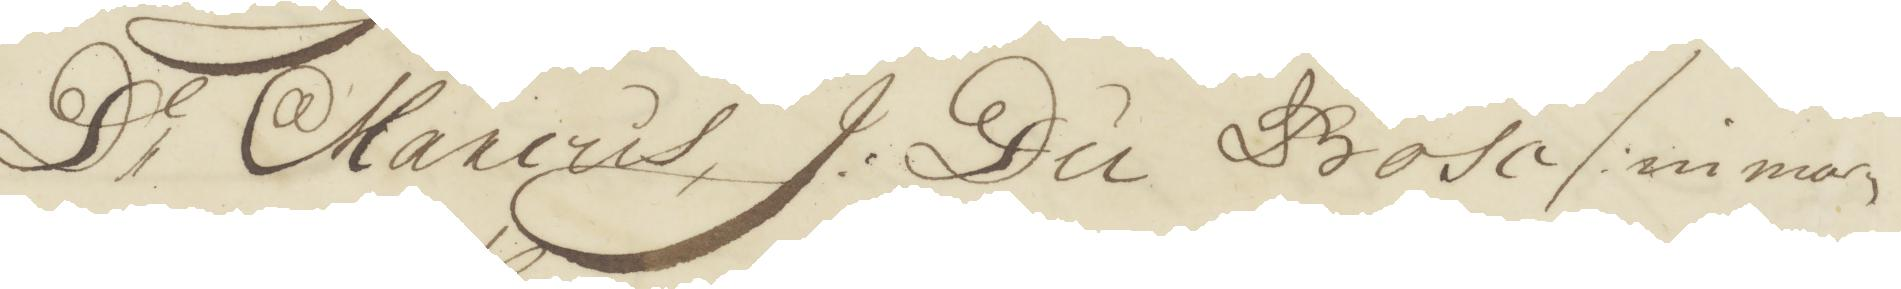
D„l Marcus, J: Du Bosc /:in mar„
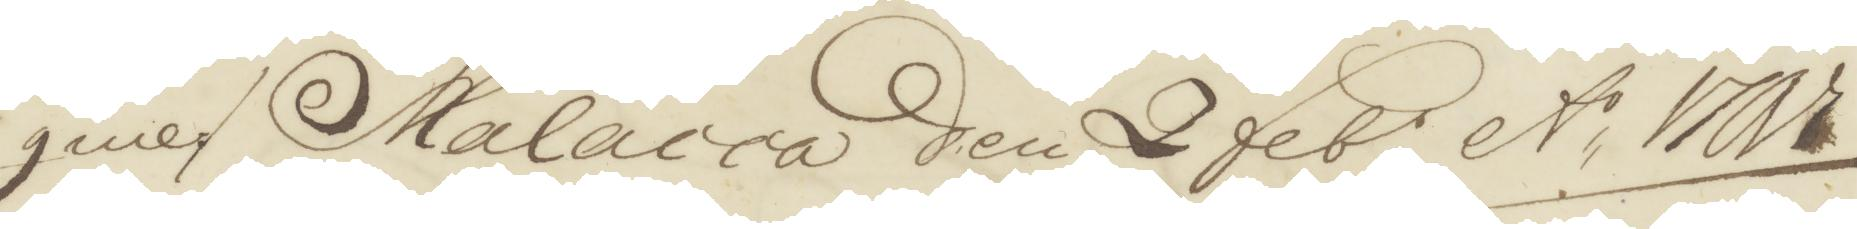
gine/ Malacca den 2 feb: A„o 1747
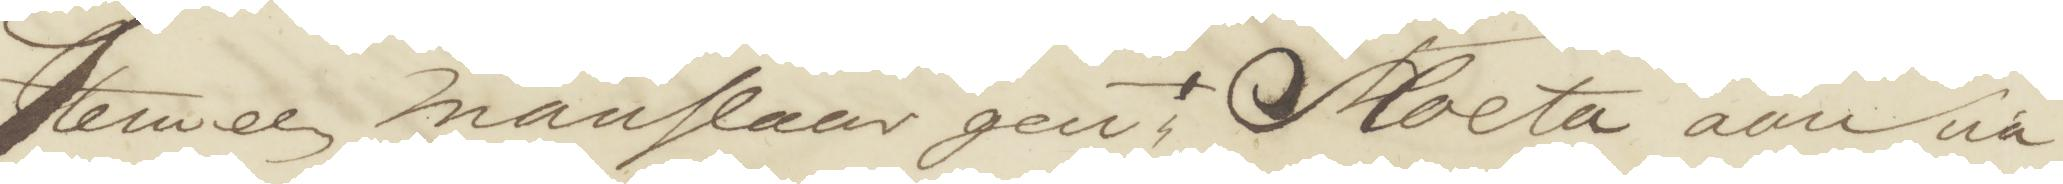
Jtem een manslaar gen„t Moeta aan na
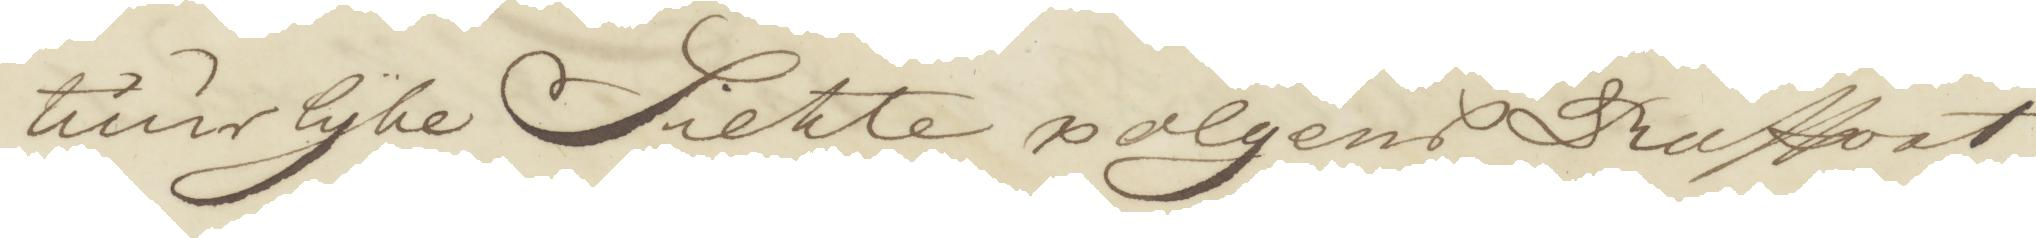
tuurlijke Siekte volgens Rapport
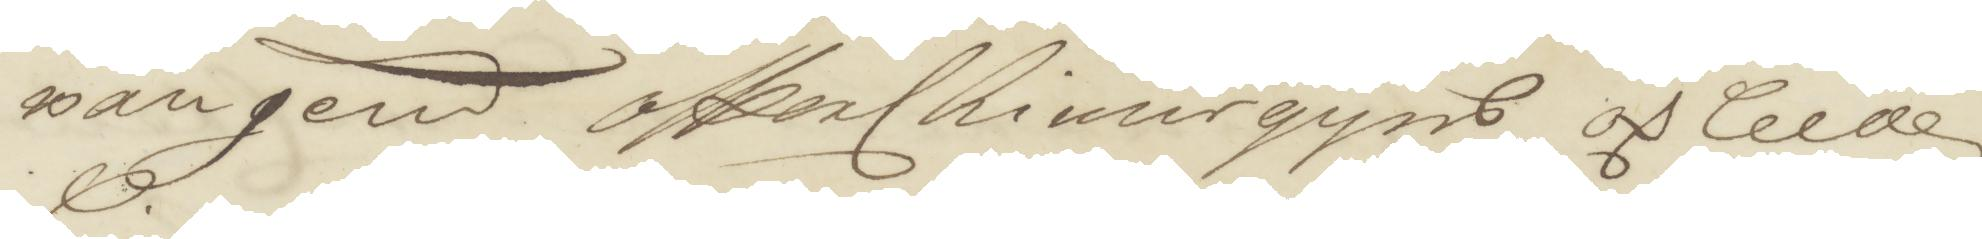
van gem opper Chirurgijns over leeden
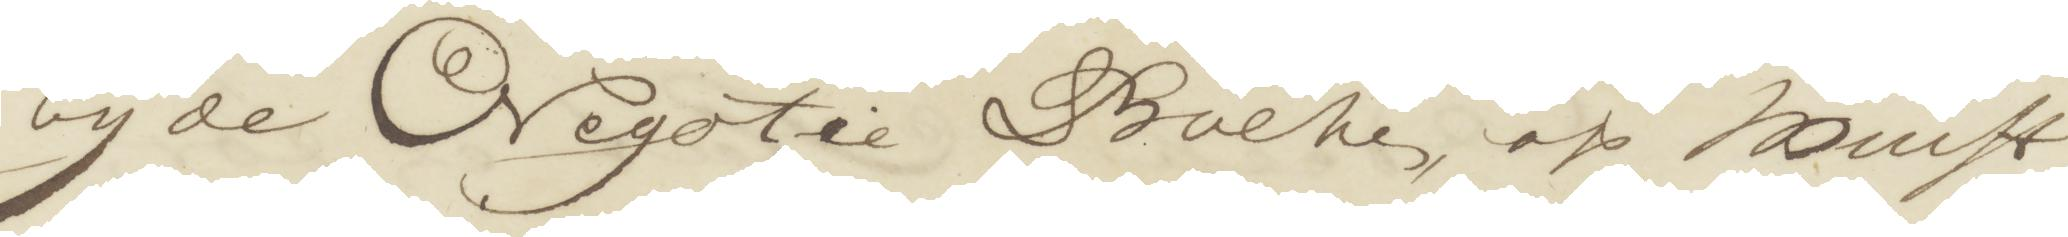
bij de Negotie Boeken, op winst
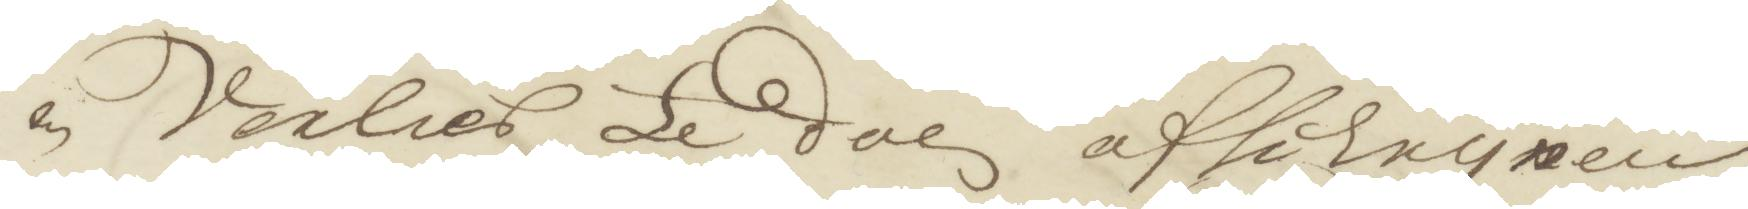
en Verlies te doen afschrijven
